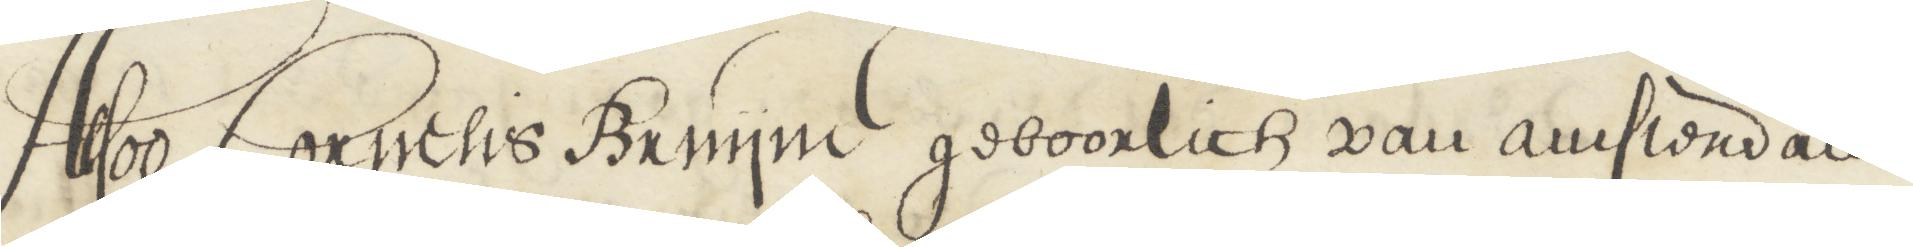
Alsoo Cornelis Bruijne geboortich van amsterdam
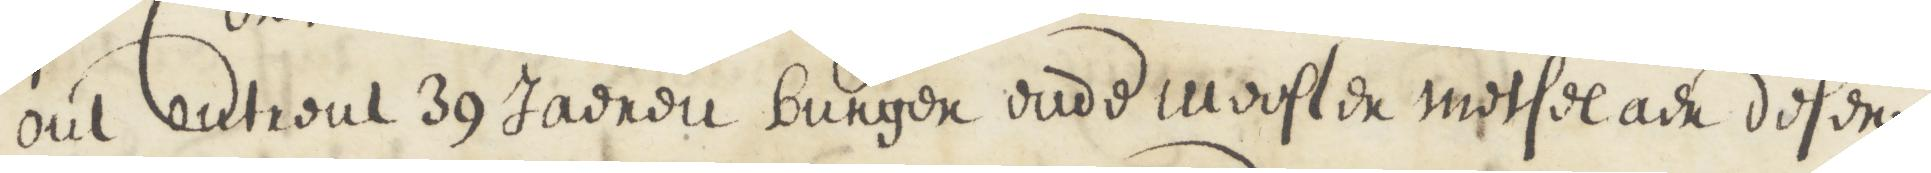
out ontrent 39 jaeren burger ende meester metselaer deser
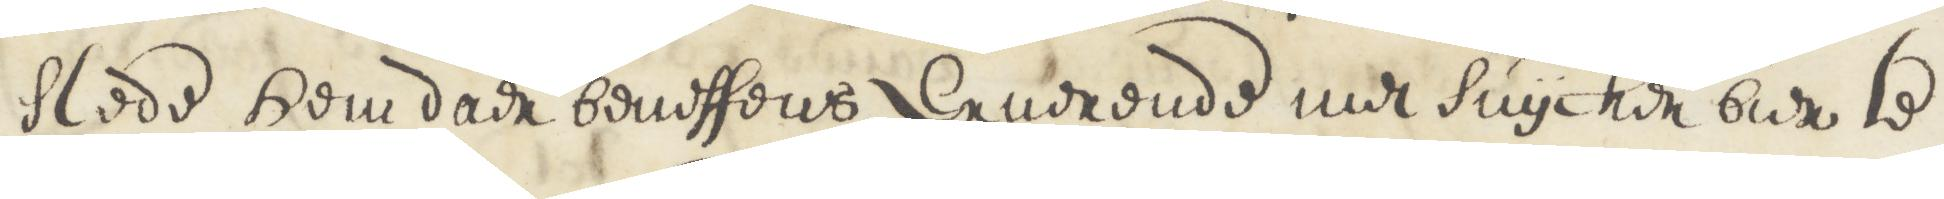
stede hem daer beneffens Ernerende met suijcker bier te
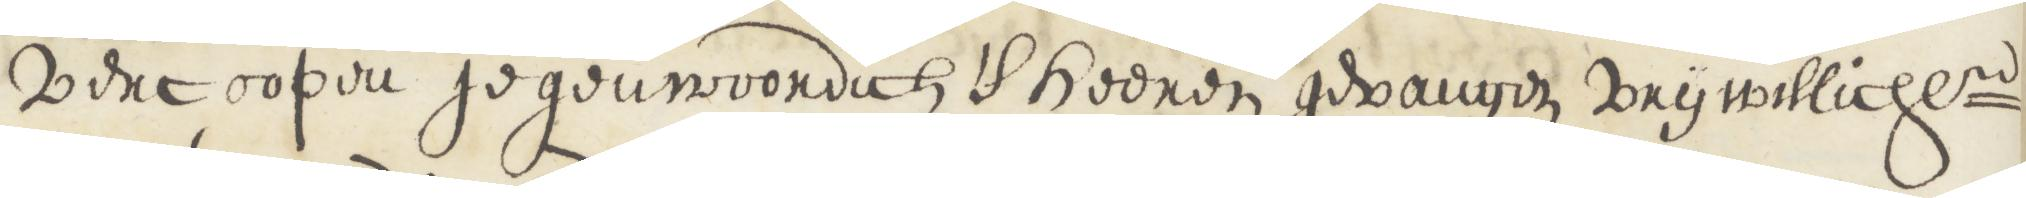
vercoopen jegenwoordich 's heeren gevangen vrijwillickl=n
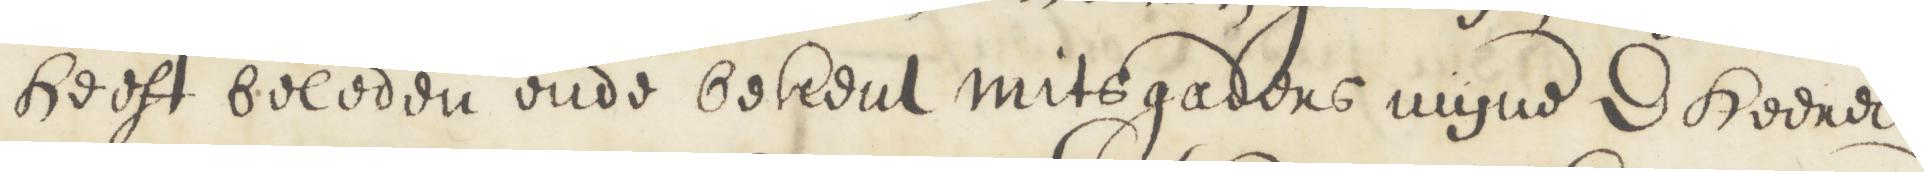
heeft beleden ende bekent mitsgaders mijne E Heeren
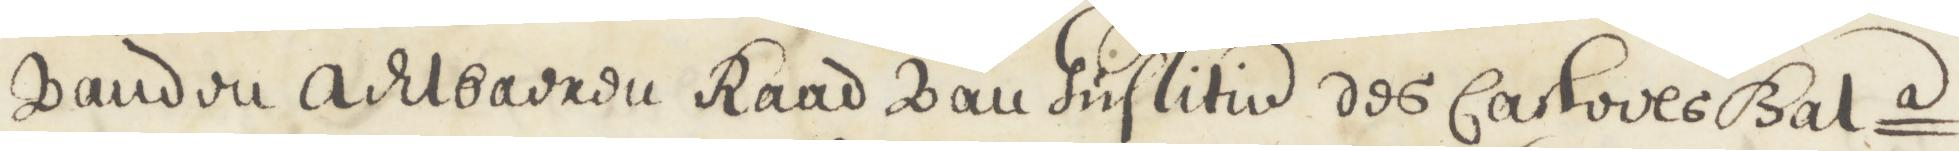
van den achtbaeren Raad van sustitie des Casteele Bat=a
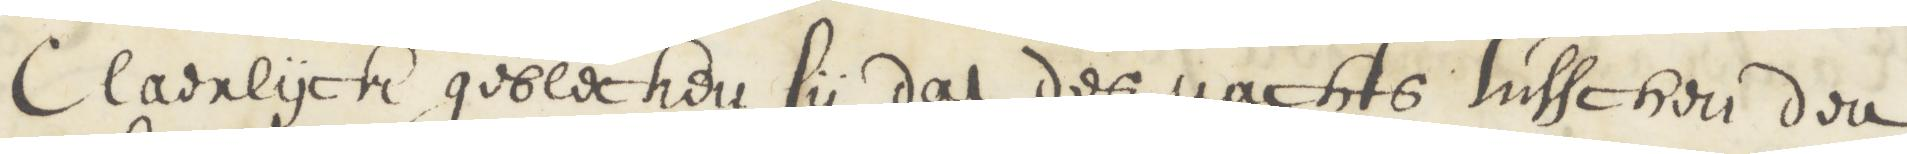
Claerlijck geblecken sij dat des nachts tusschen den
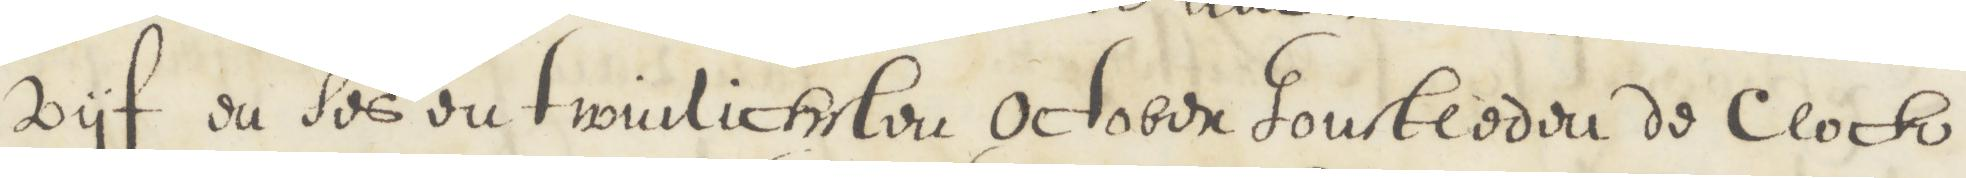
vijf en ses en twinlichsten October sonstleden de Clock
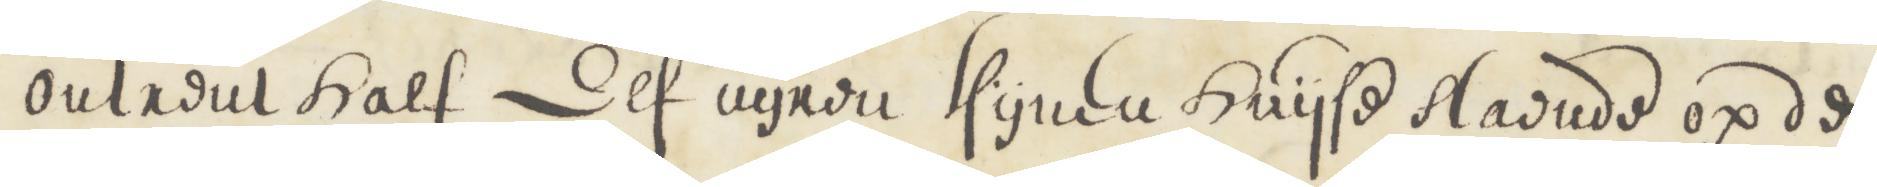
ontrent half Elf uijren tsijnen huijse staende op de
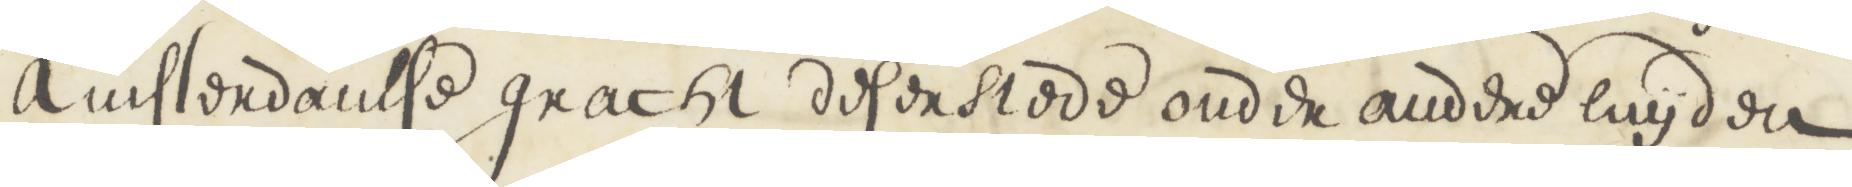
Amsterdansse gracht deser stede onder andere luijden
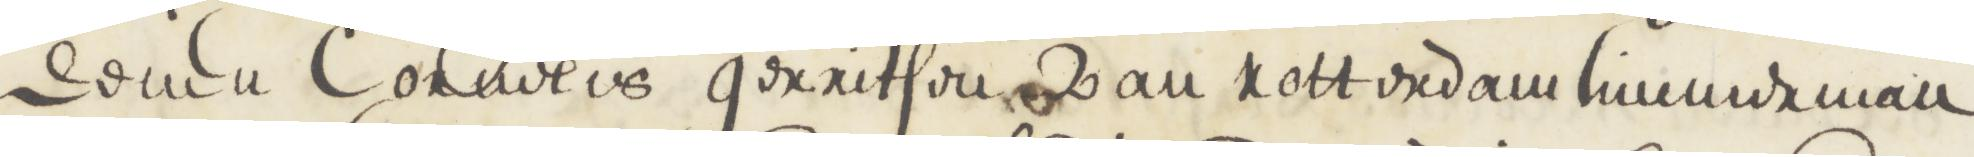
eenen Cornelis gerritsen van rotterdam timmerman
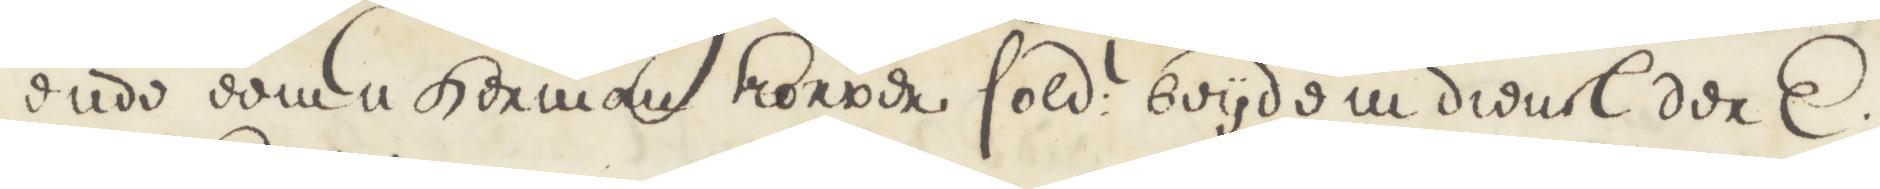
ende eenen herman korver sold:t beijde in dienst der E:
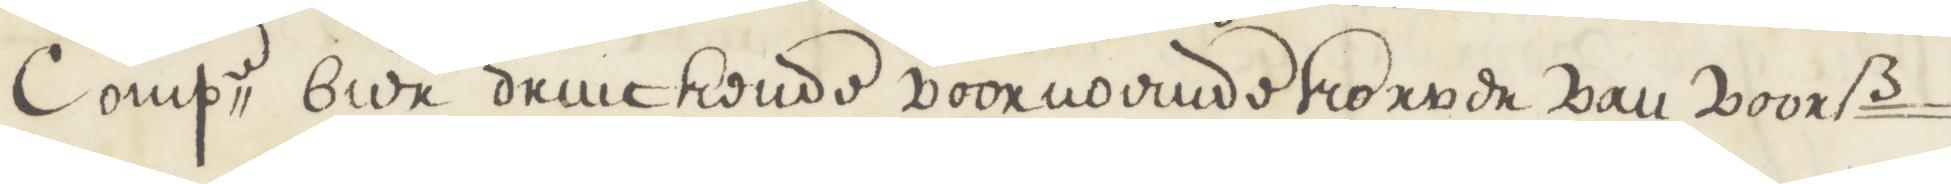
Comp„e bier drinckende voornoemde korver van voor=z
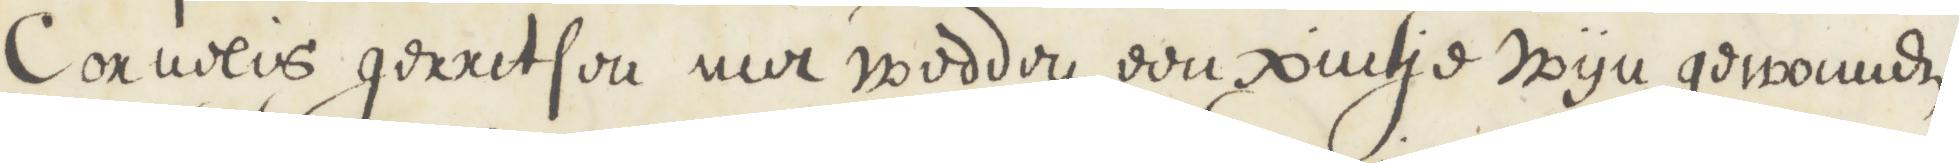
Cornelis gerritsen met wedden een pintje wijn gewonnen
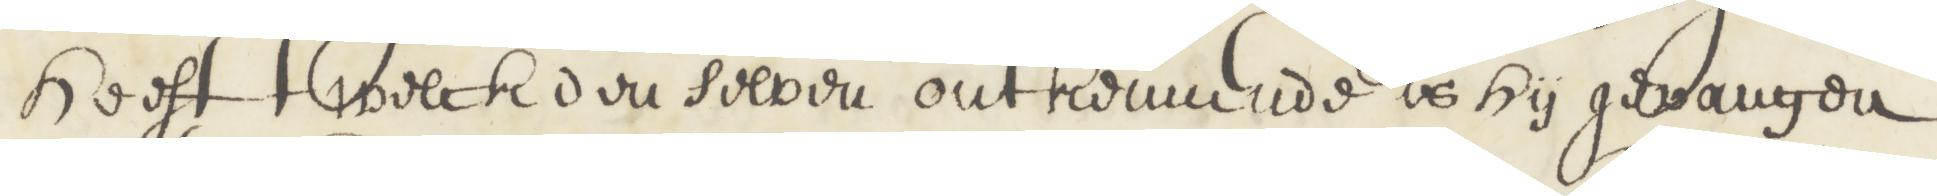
heeft t welck den selven ontkennende is hij gevangen
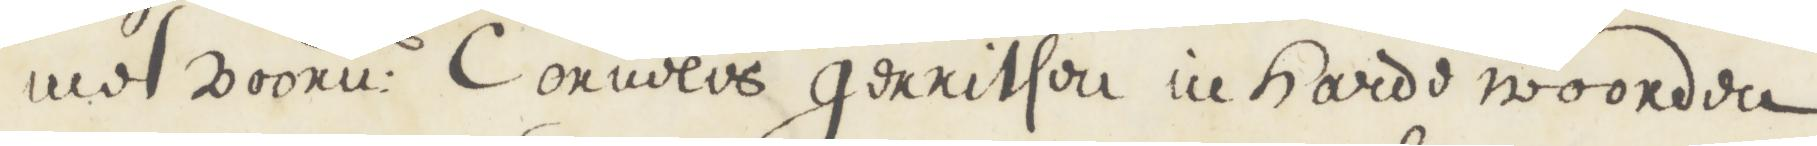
met voorn: Cornelis gerritsen in harde woorden
